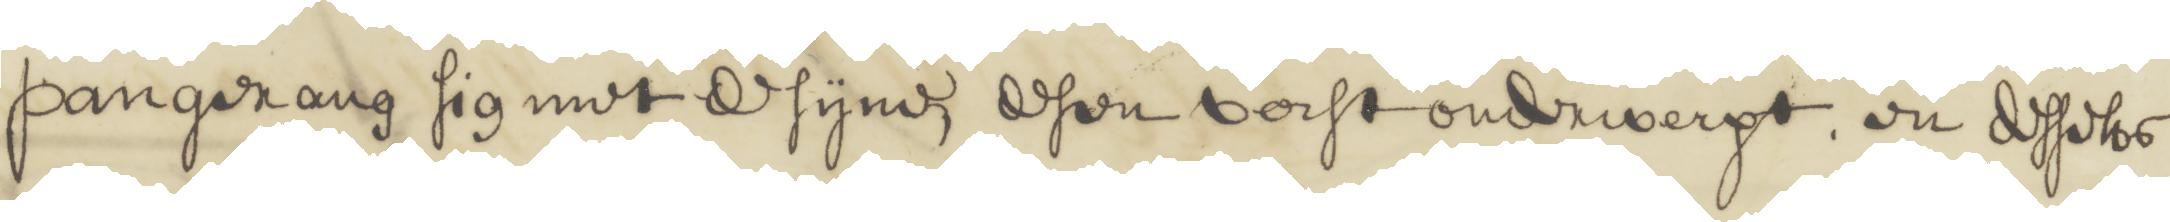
pangerang sig met de sijne, desen vorst onderwerpt, en desselvs
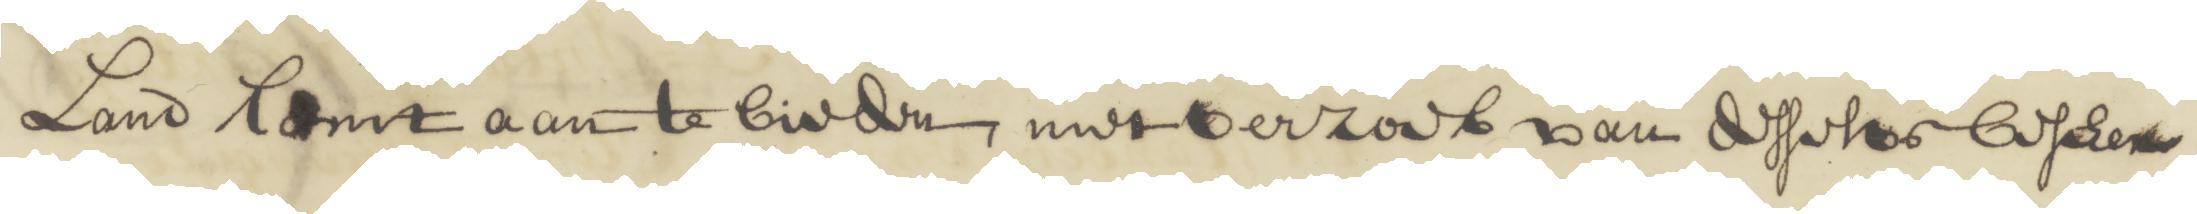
Land komt aan te bieden, met verzoek van desselvs bescher
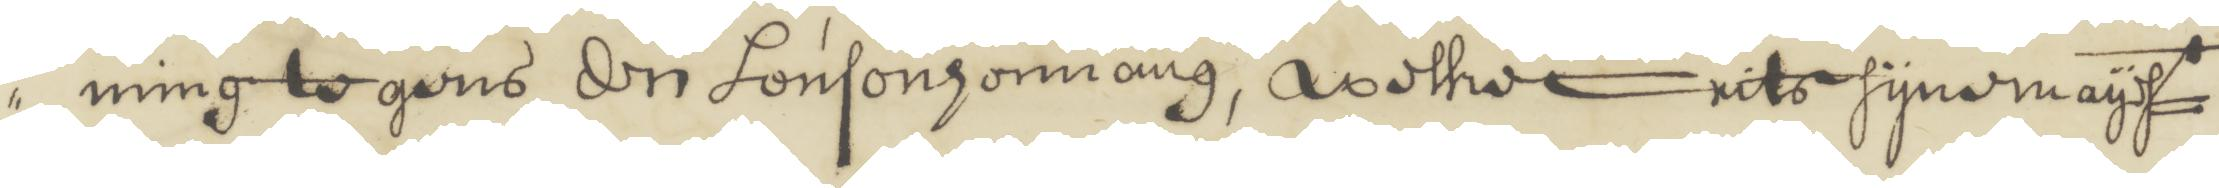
„ ming tegens den Sousouhounang, welke crits sijne maijes=t
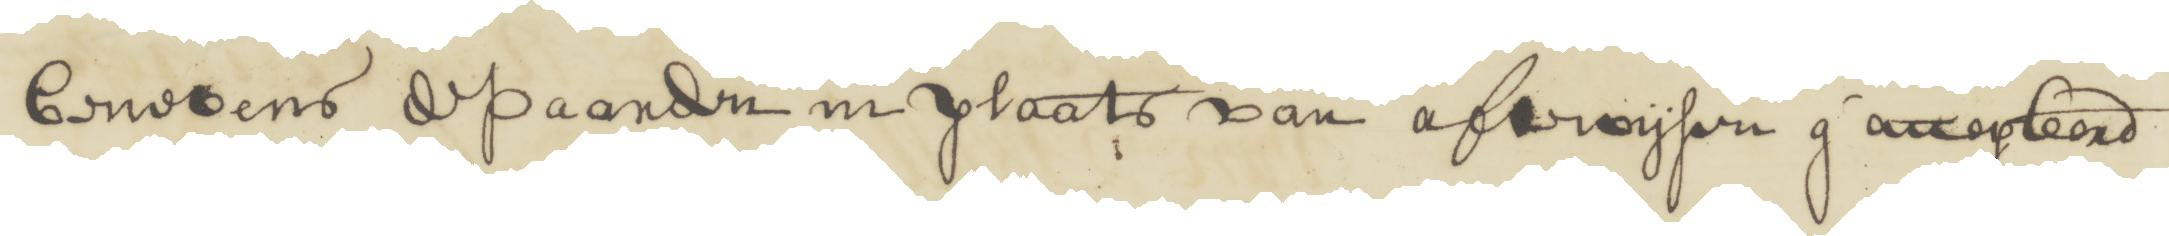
benevens de paarden in plaats van af tewijsen g’accepteerd
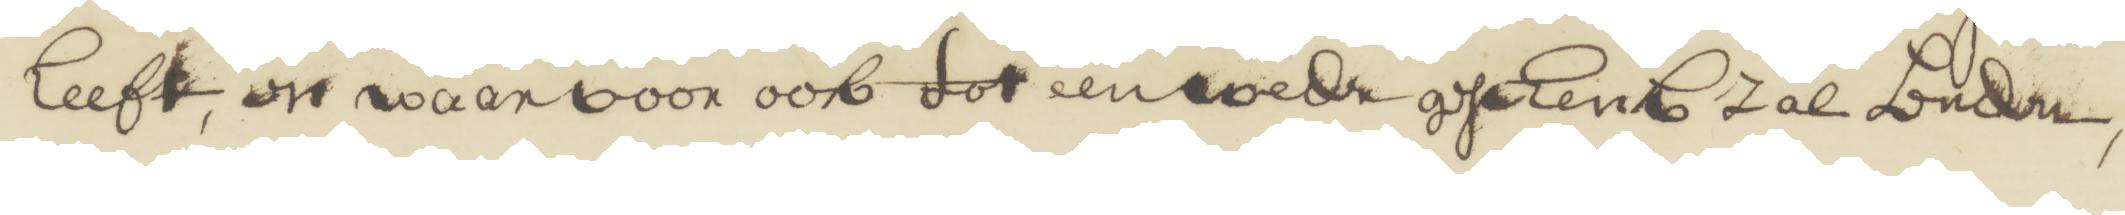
heeft, en waar voor ook tot een weder geschenk zal Senden,
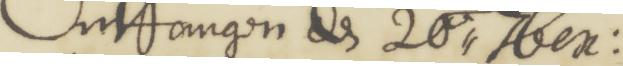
Ontfangen den 20„e 7ber:
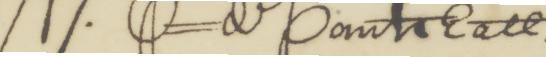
1717. p=r de pantchall.
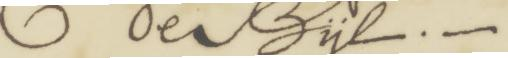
de Bijl.—
